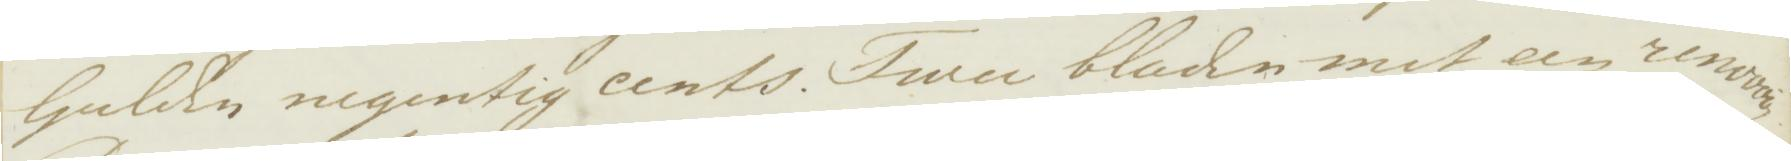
Gulden negentig cents. Twee bladen met een renvooi
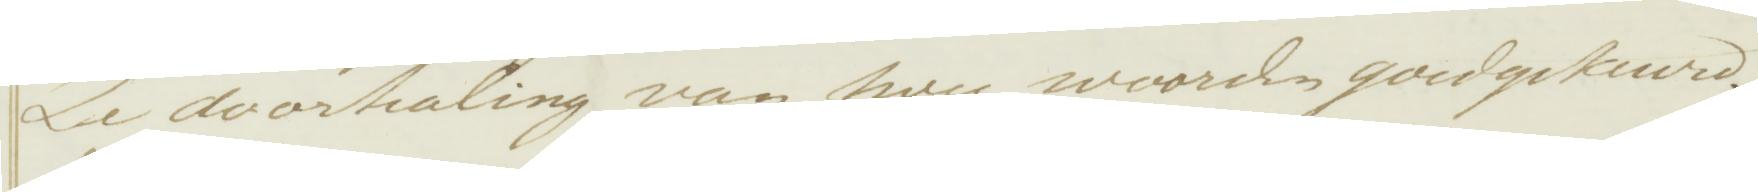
De doorhaling van twee woorden goedgekeurd
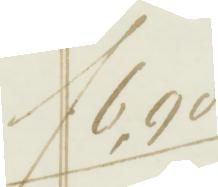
f 6,90
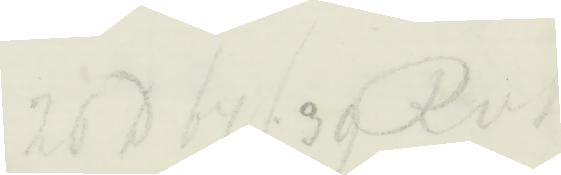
26 D 67/39 Rv
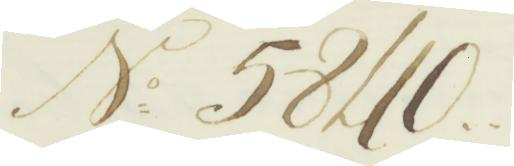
N=o 5840.-
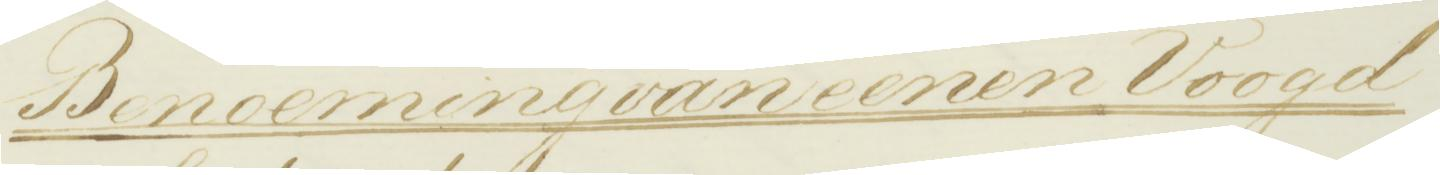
Benoeming van eenen Voogd
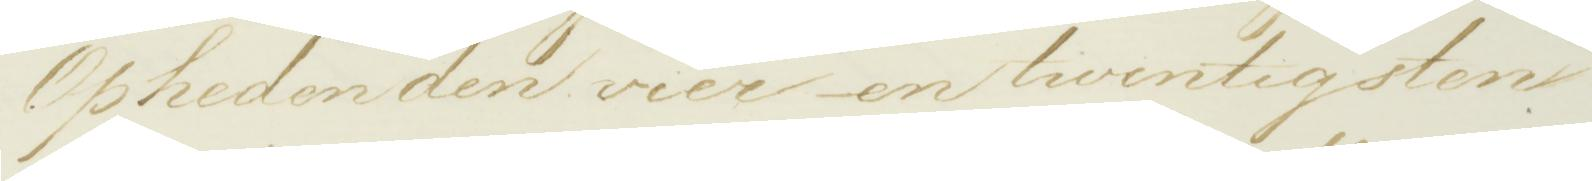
Op heden den vier en twintigsten
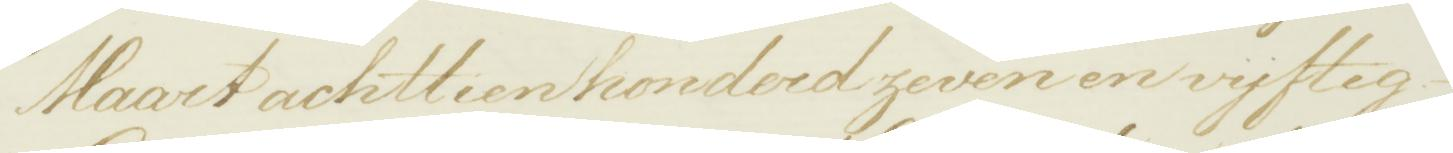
Maart achttien honderd zeven en vijftig
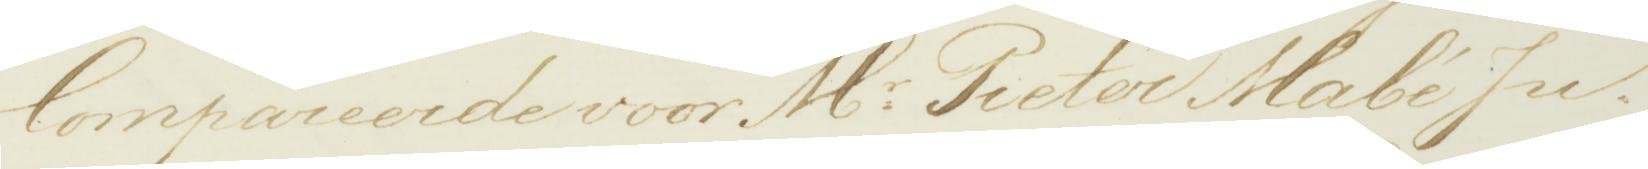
Compareerde voor M=r Pieter Mabé Ju„
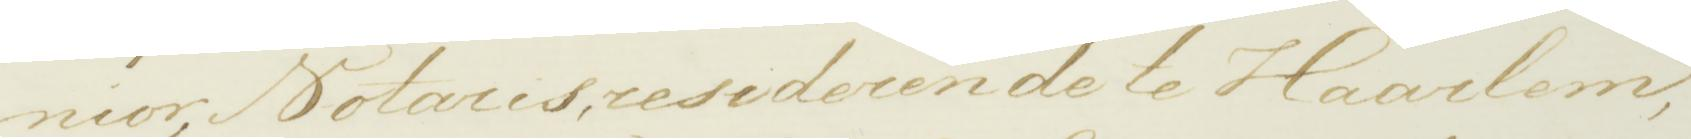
nior, Notaris, residerende te Haarlem,
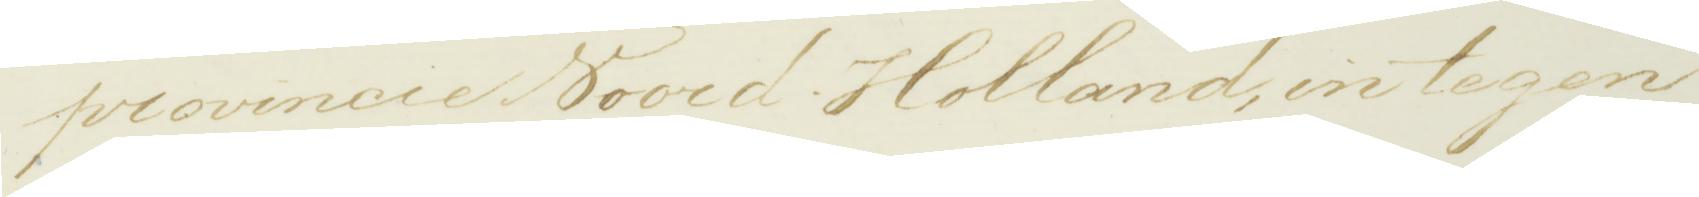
provincie Noord Holland, in tegen
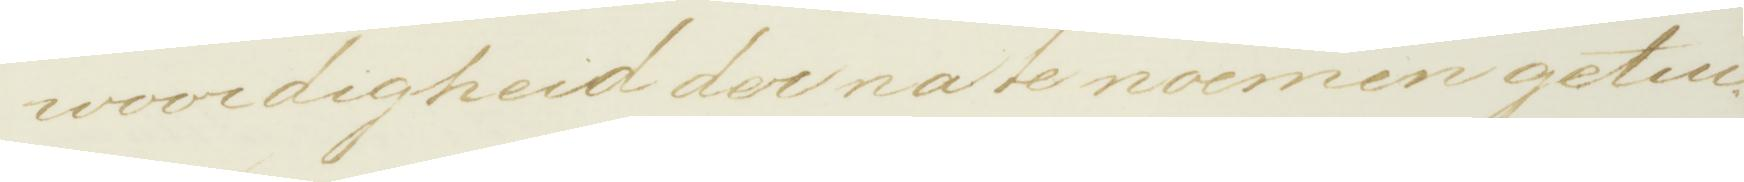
woordigheid der na te noemen getui
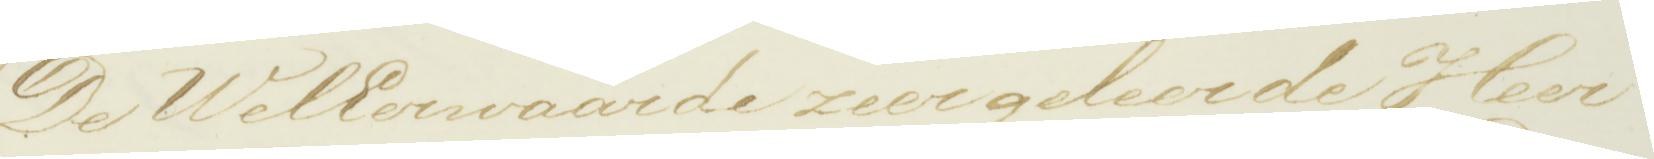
De WelEerwaarde zeer geleerde Heer
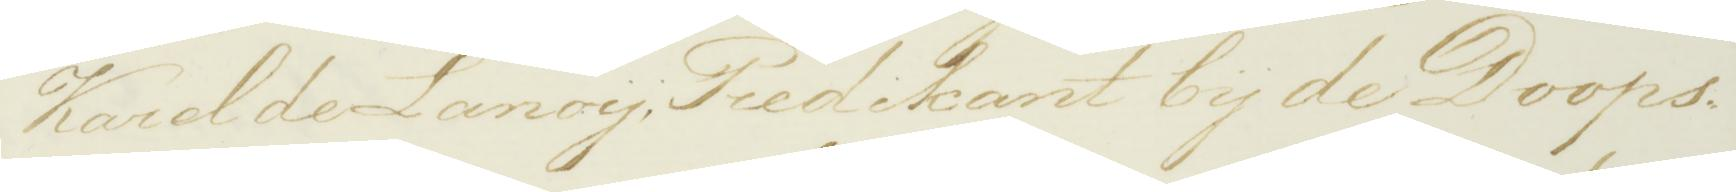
Karel de Lanoij Predikant bij de Doops„
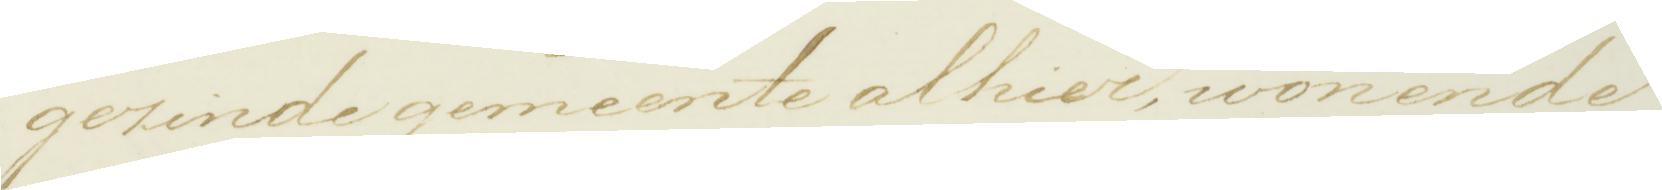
gezinde gemeente alhier, wonende
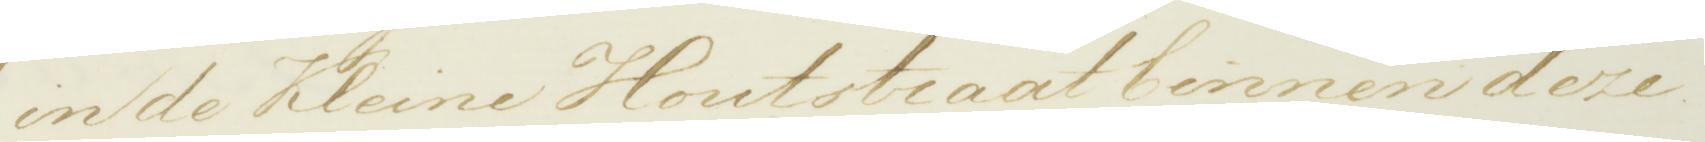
in de Kleine Houtstraat binnen deze
